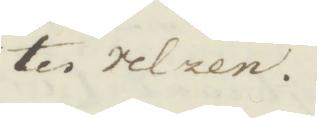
te velzen.
